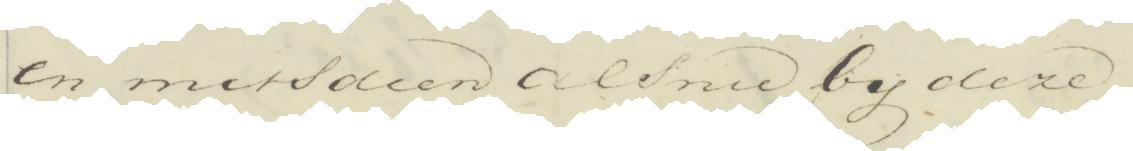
en mitsdien alsnu by deze,
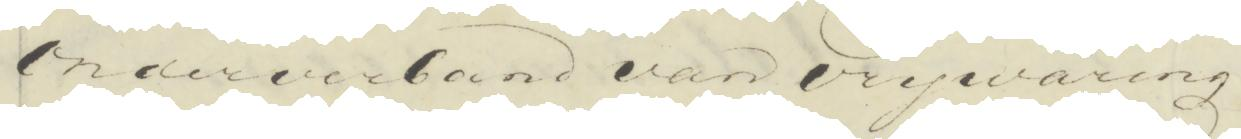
onder verband van vrywaring
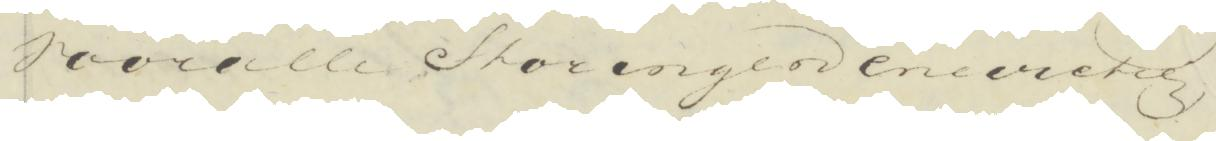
voor alle storingen en wettige,
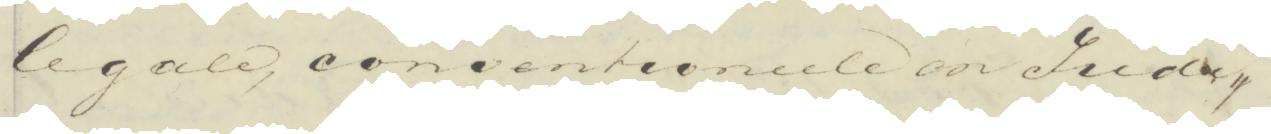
legale, conventioneele en Iudi
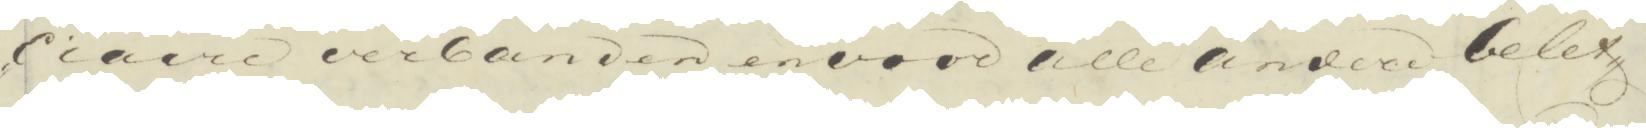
„ciaire verbanden en voor alle andere belet
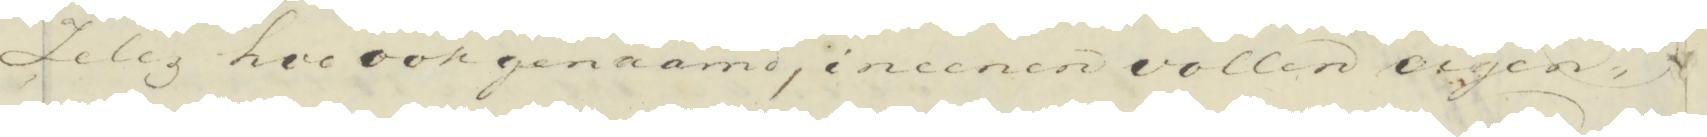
„zelen hoe ook genaamd, in eenen vollen eigen„
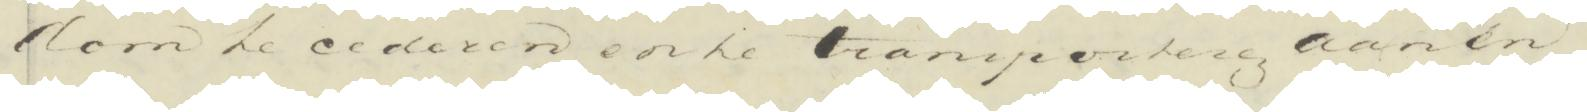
dom te cederen en te transporteren, aan en
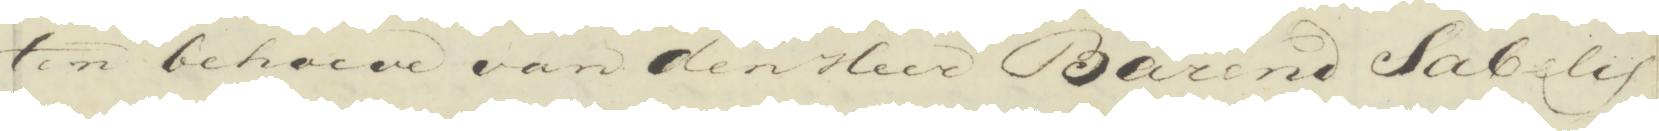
ten behoeve van den Heer Barend Sabelis
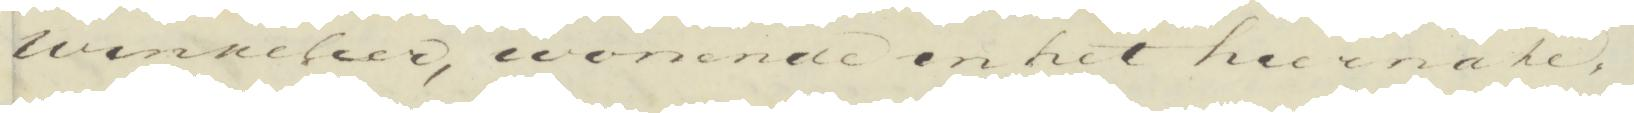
winkelier, wonende in het hierna te„
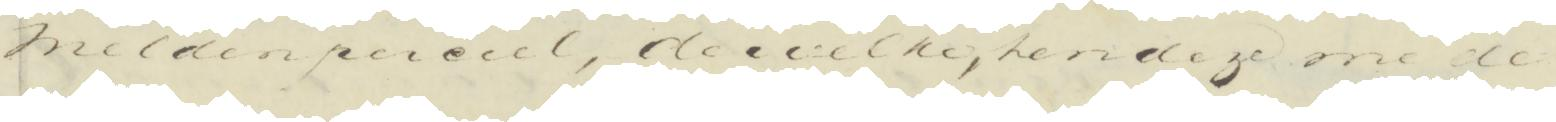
melden perceel, dewelke, ten deze me de
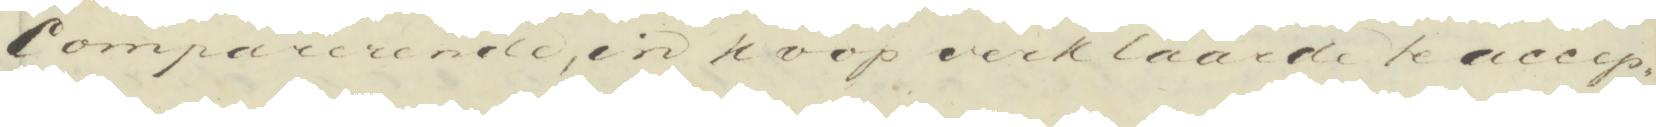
Comparerende, in koop verklaarde te accep„
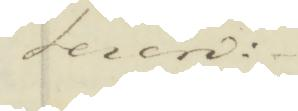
teren: -
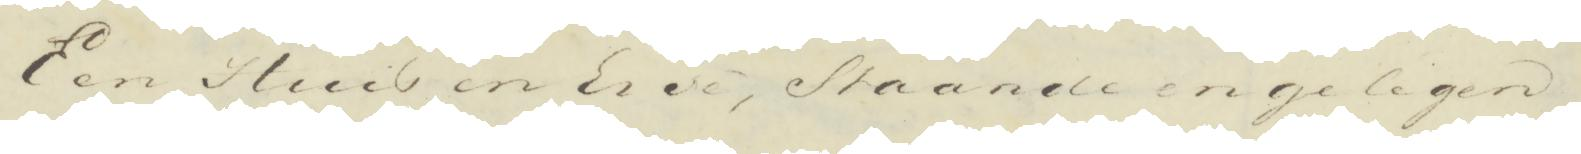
Een Huis en Erve, staande en gelegen
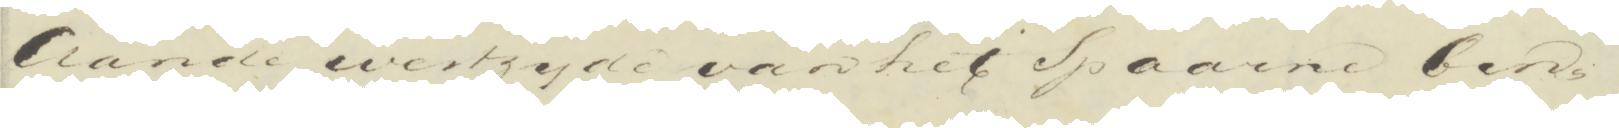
Aande westzyde van het Spaarne bin„
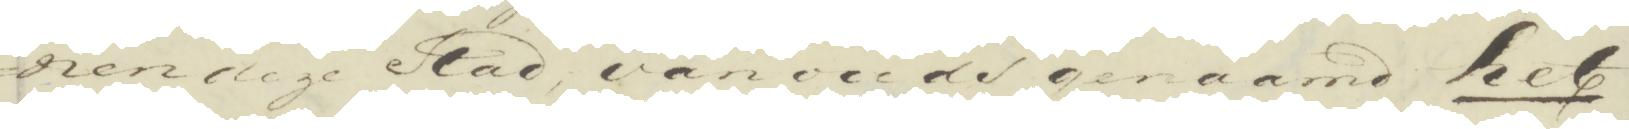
nen deze Stad, van ouds genaamd het
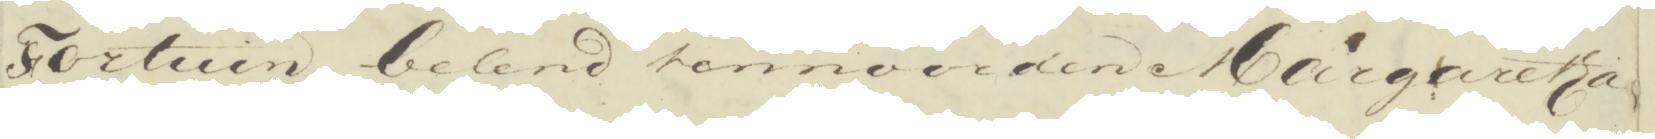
Fortuin, belend ten noorden Margaretha
